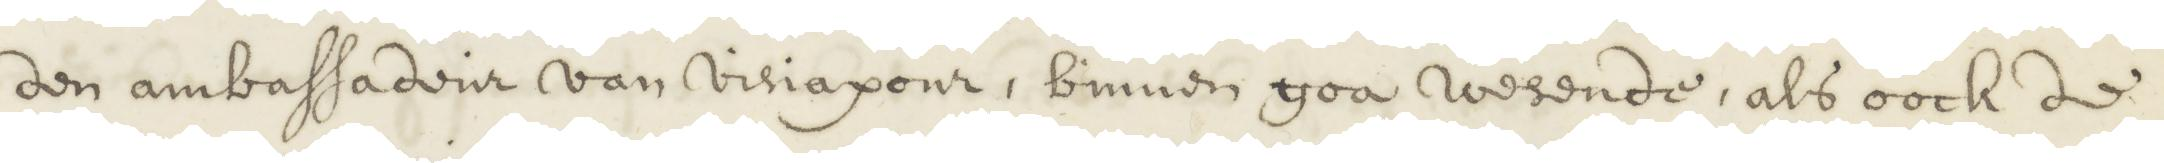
den ambassadeur van visiapour, binnen goa wesende, als oock de
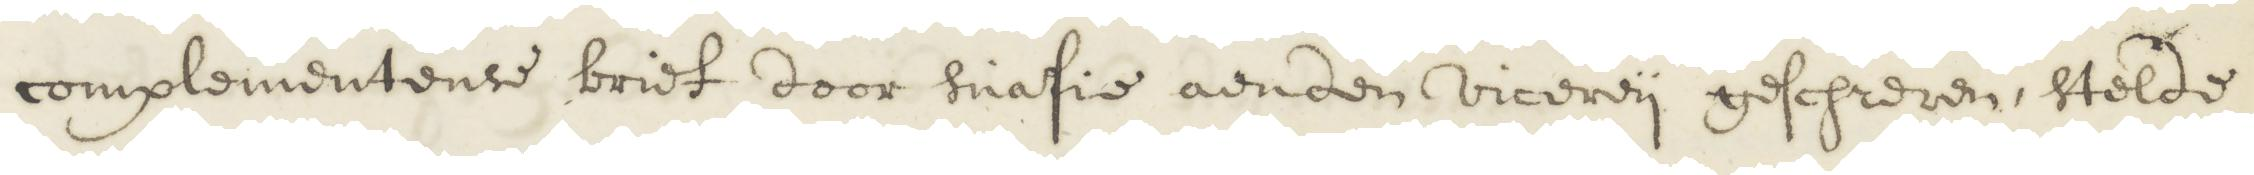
complementeuse brief door suasie aenden vicereij geschreven, stelde
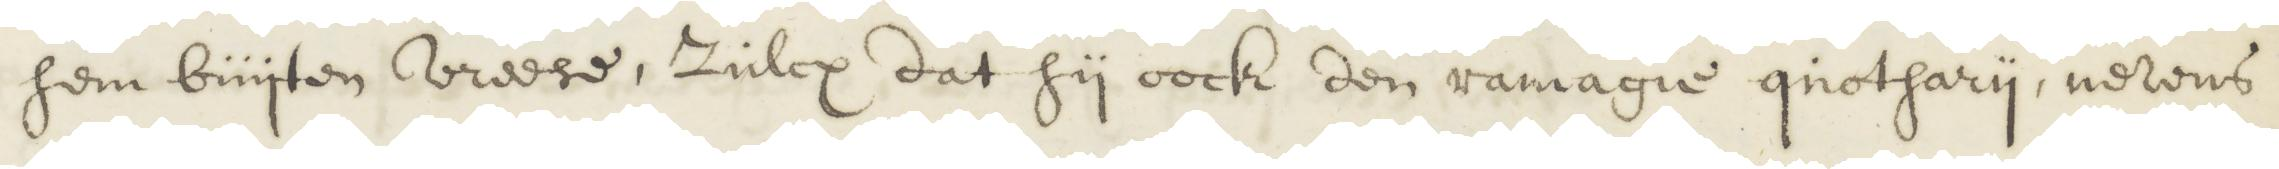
hem buijten vreese, zulcx dat hij oock den ramagie quotharij, nevens
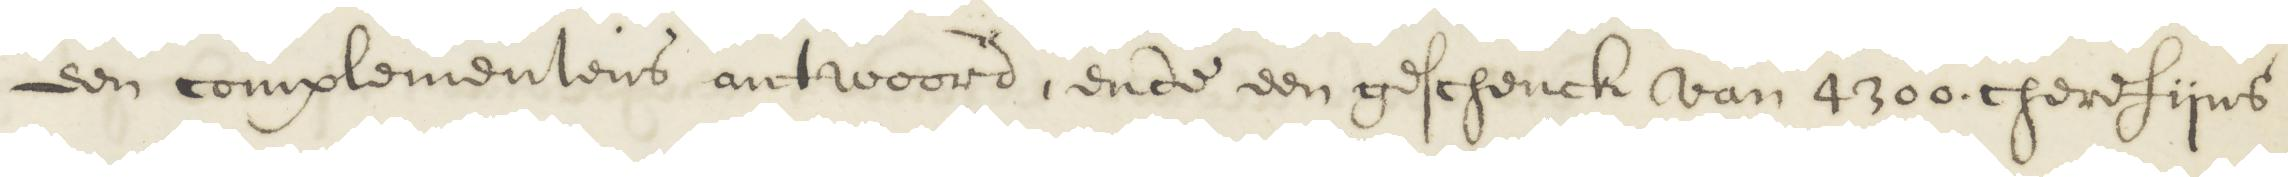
een complementeus antwoord, ende een geschenck van 4300. cherefijns
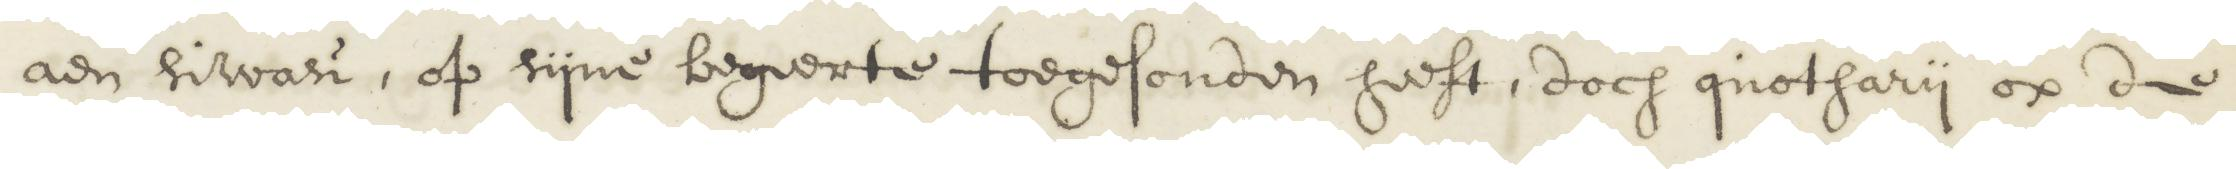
aen siwasi, op sijne begeerte toegesonden heeft, doch quotsarij op de
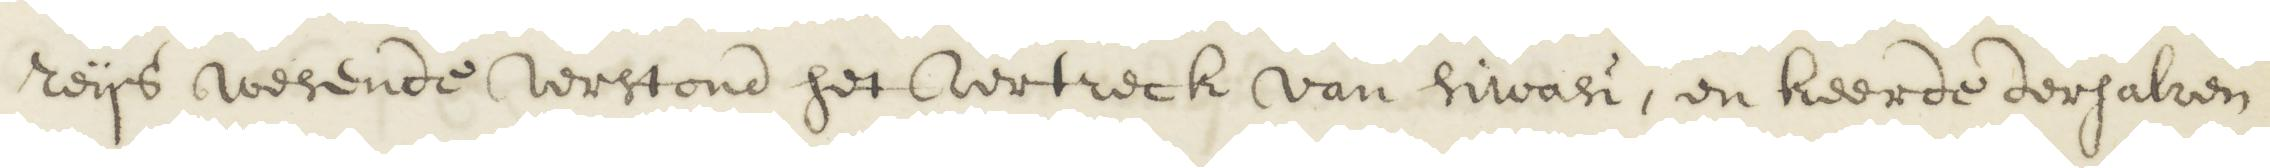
reijs wesende verstond het vertreck van siwasi, en keerde dersaken
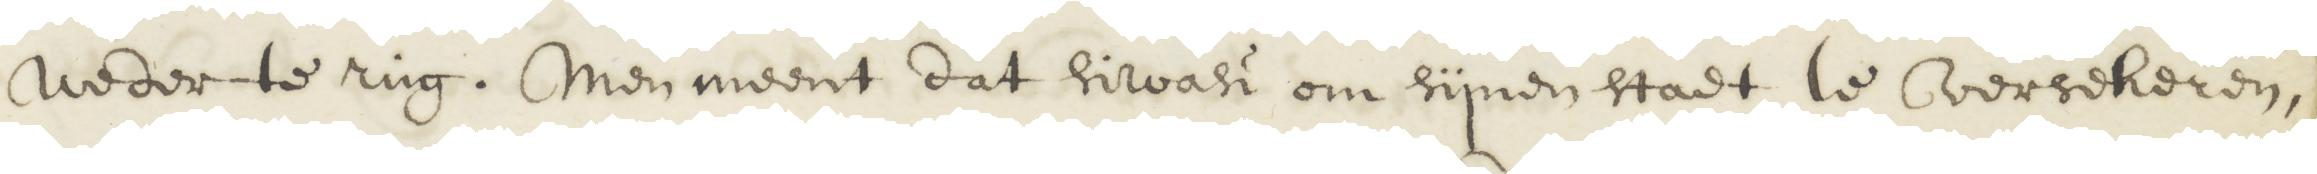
weder te rug. Men meent dat siwasi om sijnen staet te versekeren,
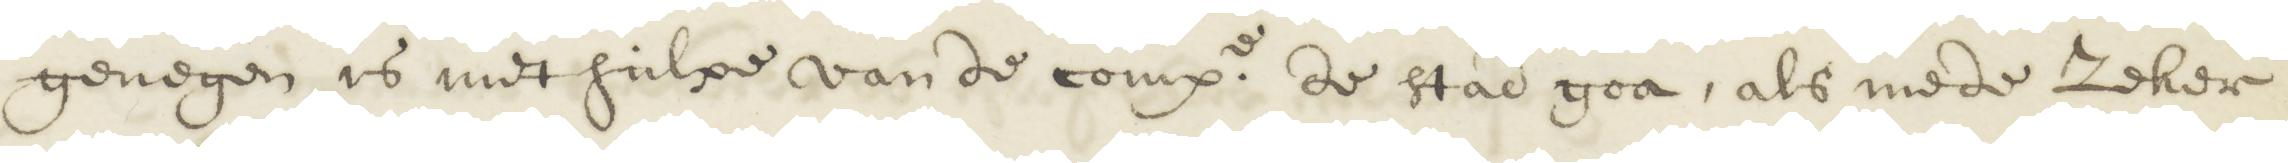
genegen is met hulpe van de comp:e de stad goa, als mede zeker
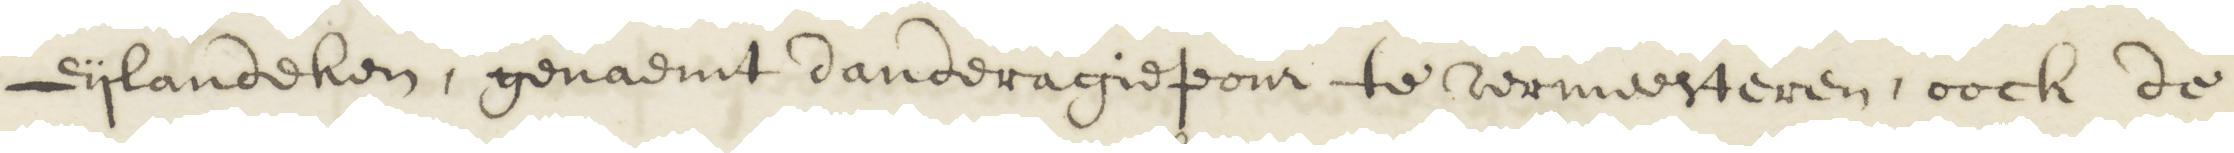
Eijlandeken, genaemt danderagiepour te vermeesteren, oock de
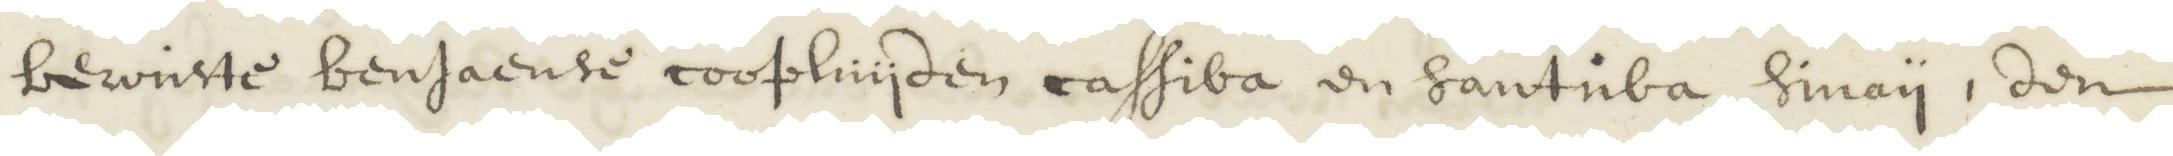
bewuste benjaense coopluijden cassiba en santuba sinaij, den
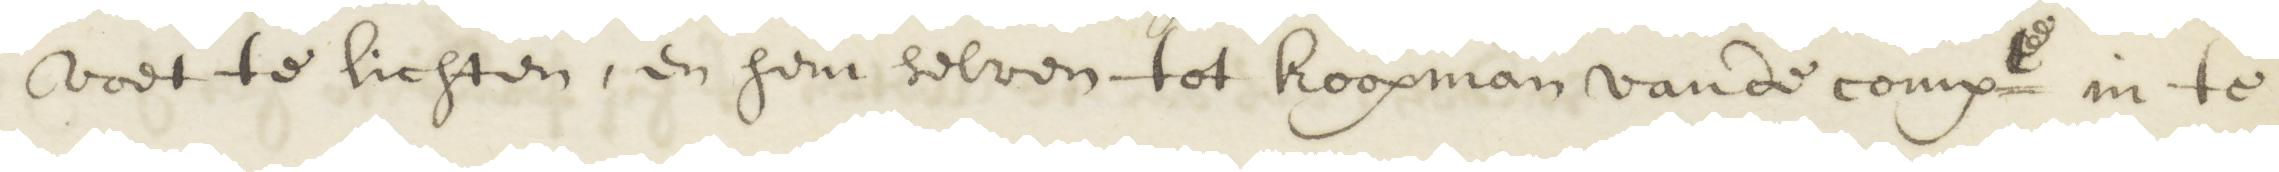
voet te lichten, en hem selven tot koopman vande comp=e in te
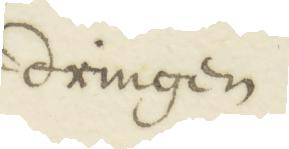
dringen
